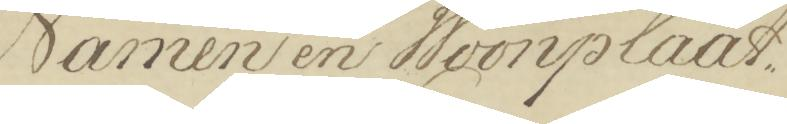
Namen en Woonplaat„
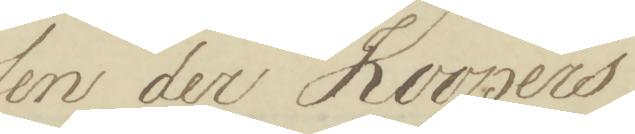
sen der Koopers
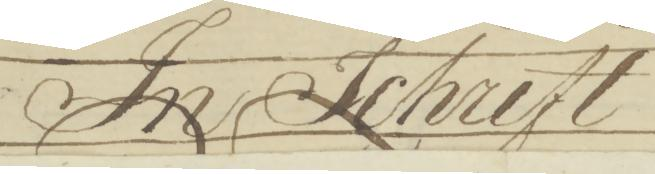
In Schrift
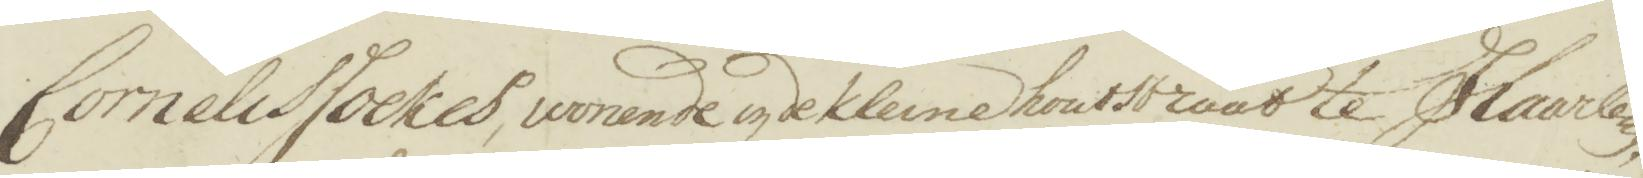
Cornelis Joekes, wonende in de kleine houtstraat te Haarlem,
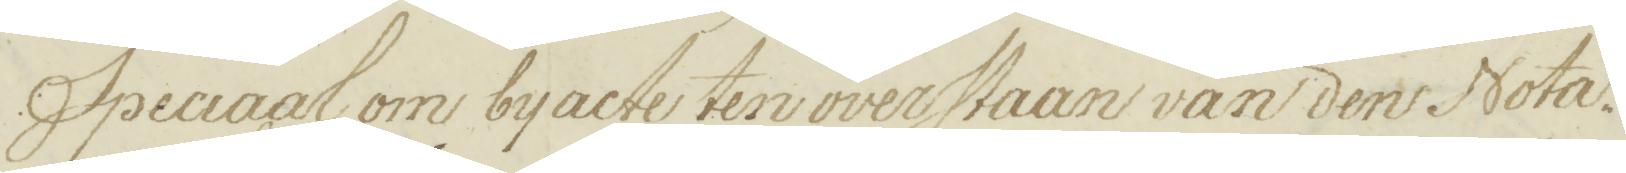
Speciaal om by acte ten overstaan van den Nota„
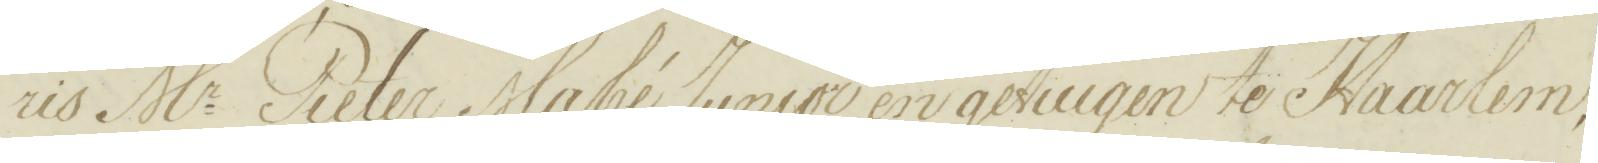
ris M:r Pieter Mabé Junior en getuigen te Haarlem,
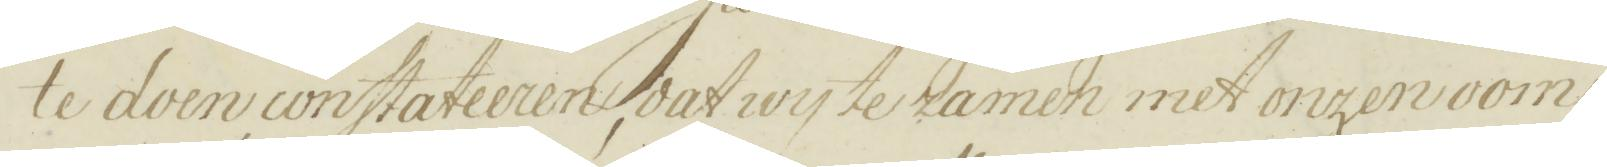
te doen constateeren, dat wy te zamen met onzen oom,
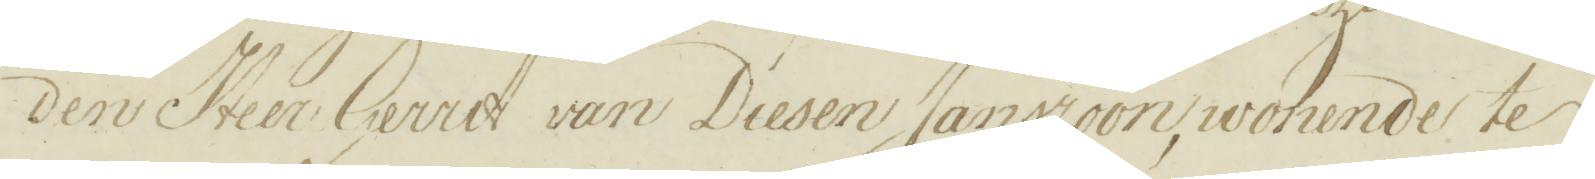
den Heer Gerrit van Diesen Janszoon, wonende te
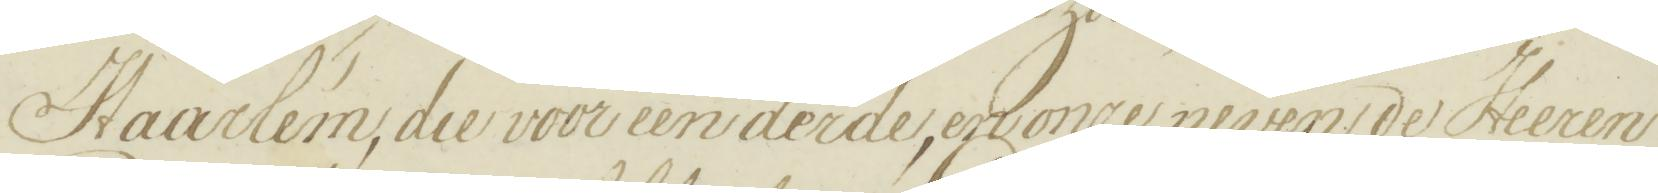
Haarlem, die voor een derde, en onze neven de Heeren
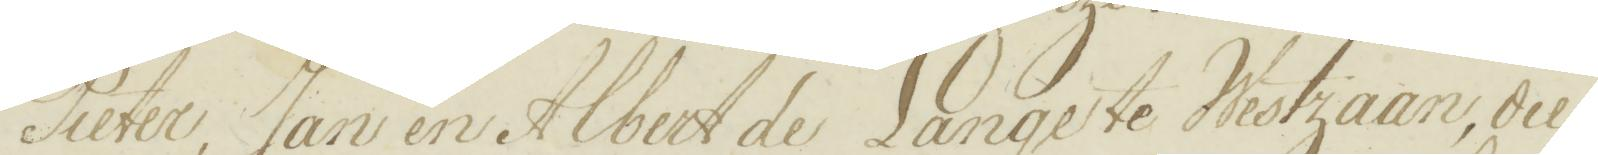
Pieter, Jan en Albert de Lange te Westzaan, die
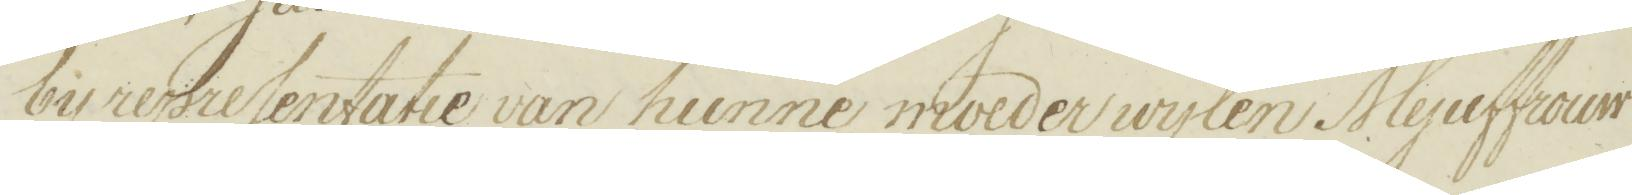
by representatie van hunne moeder wylen Mejuffrouw
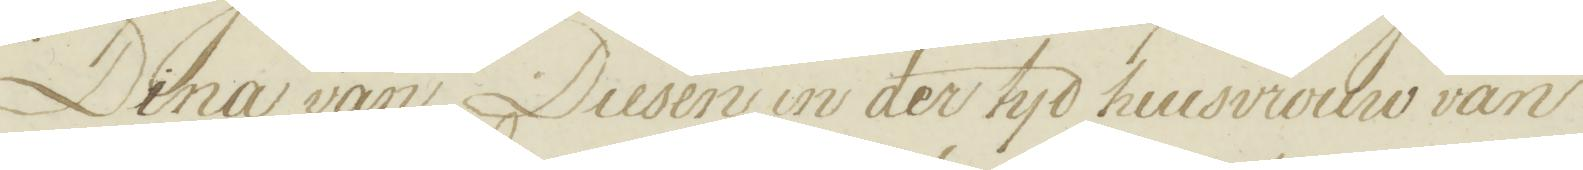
Dina van Diesen, in der tyd huisvrouw van
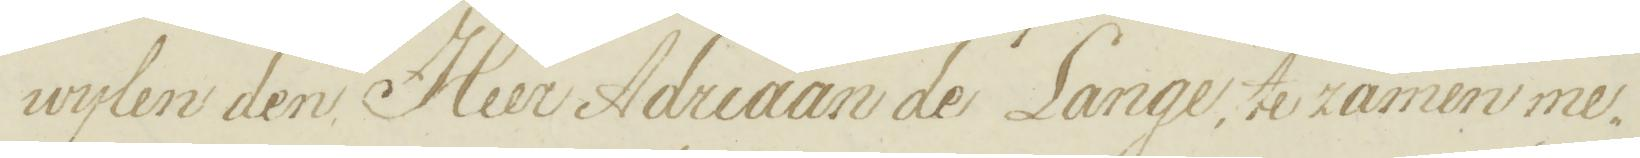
wijlen den Heer Adriaan de Lange, te zamen me„
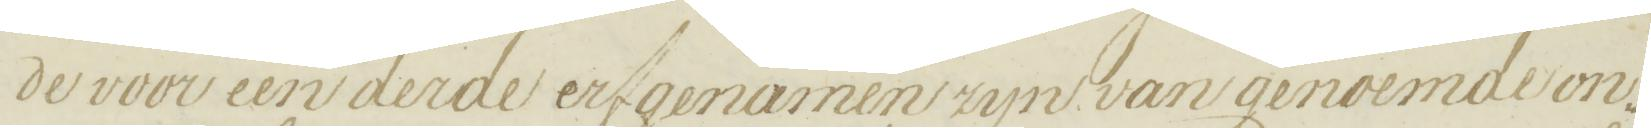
de voor een derde erfgenamen zyn van genoemde on„
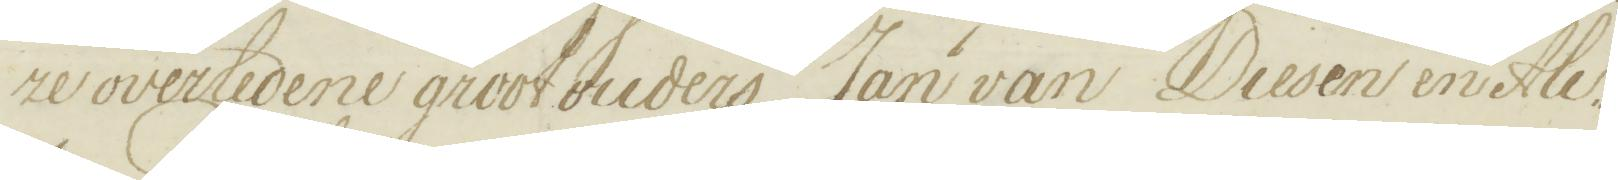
ze overledene groot ouders Jan van Diesen en Ali„
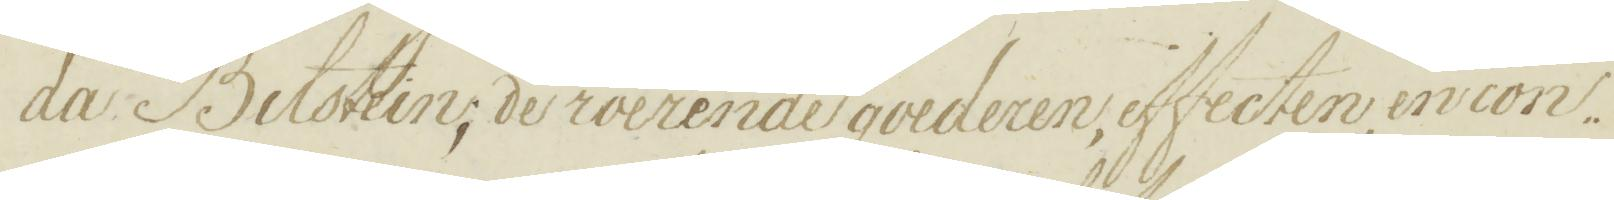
da Bilstein, de roerende goederen, effecten en con„
